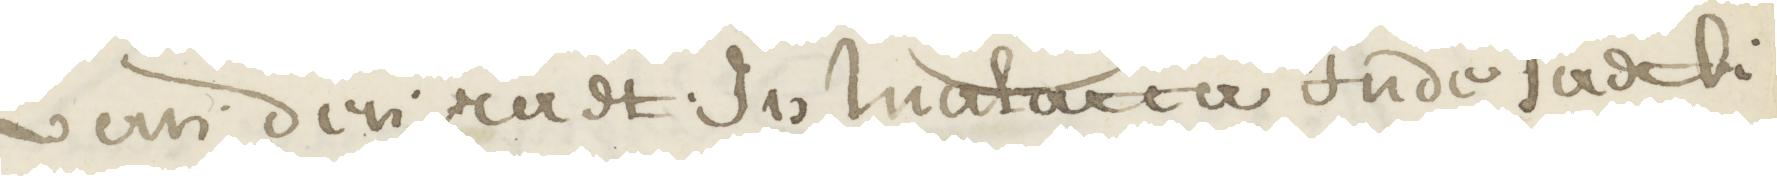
van den raet In malacca Inde saeck
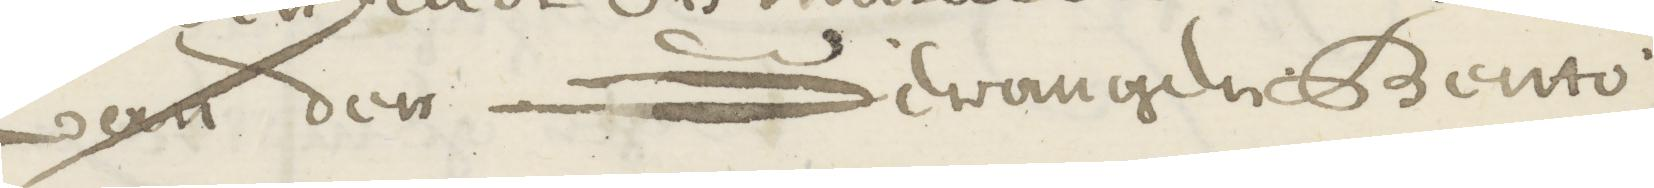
van den Gevangen Bento
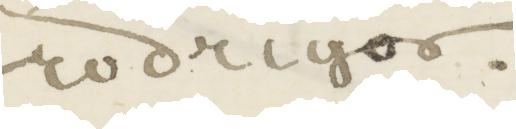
rodrigos.
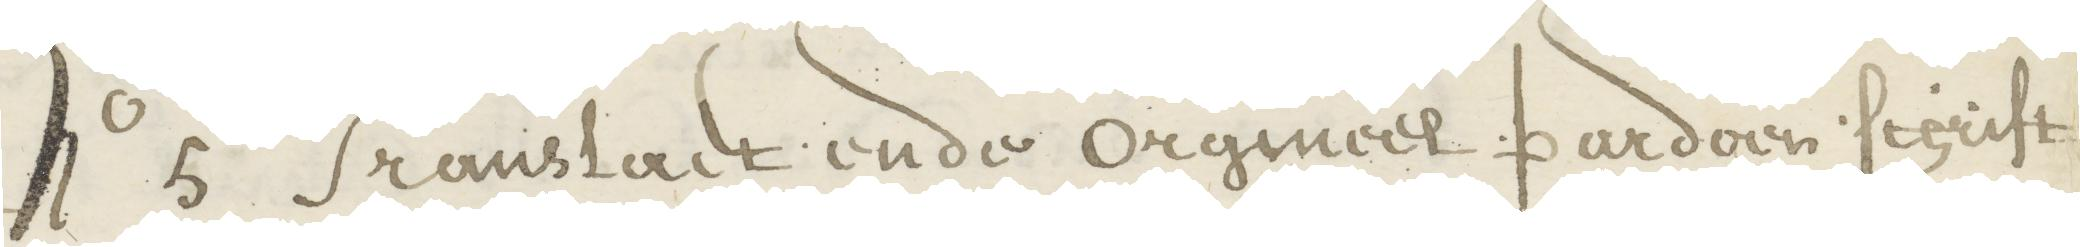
No 5 Translaet ende orgineel pardoen schrift
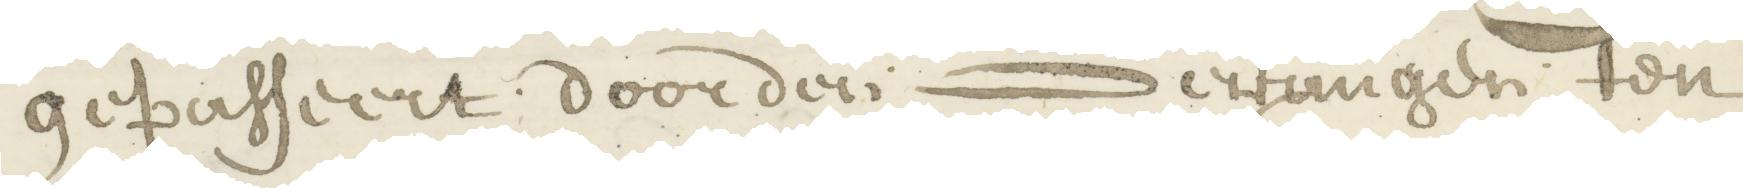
gepasseert door den Gevangen ten
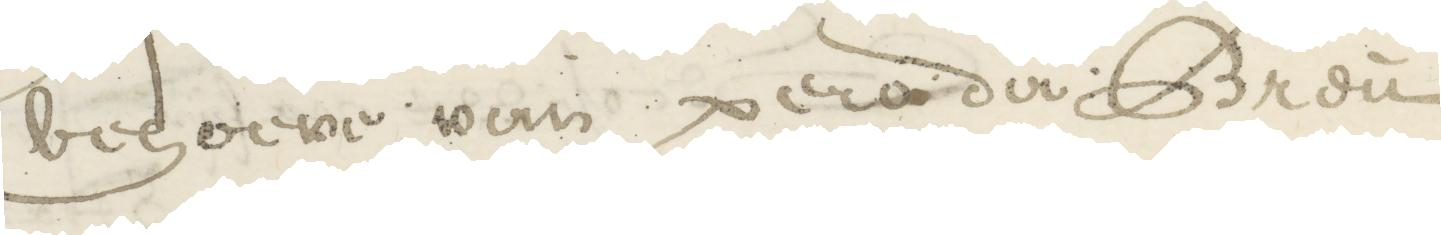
behoeve van pero da Breu
